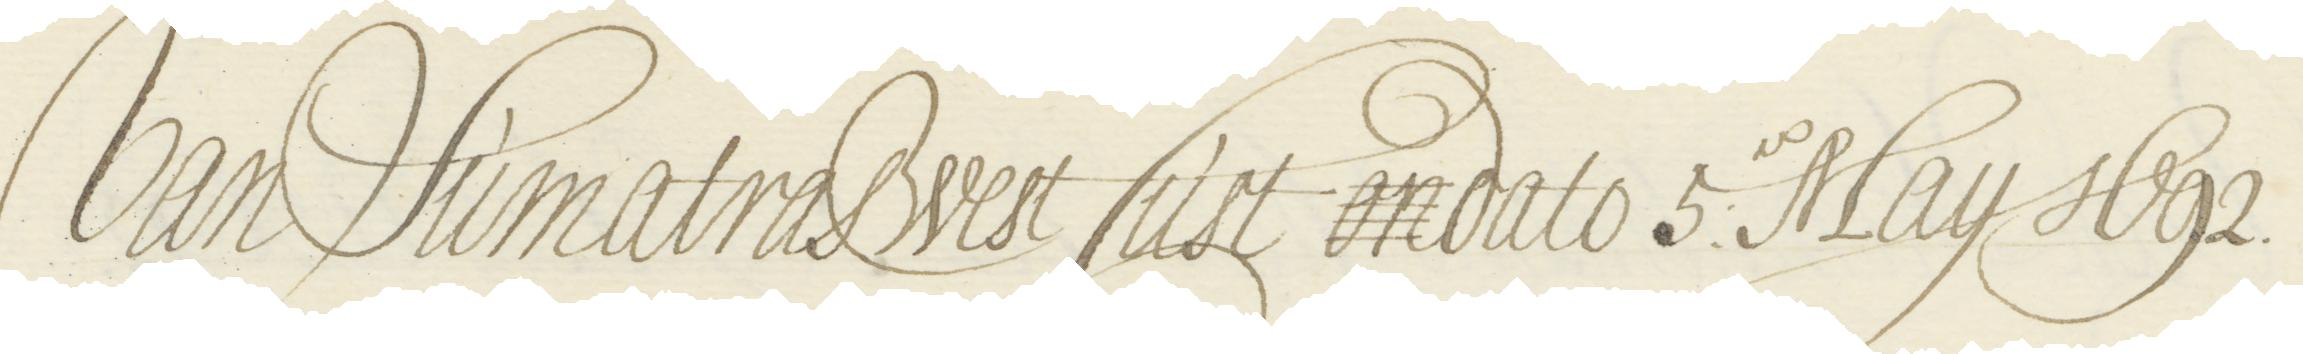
Van Sumatra west Cust ondato 5:e May 1692.
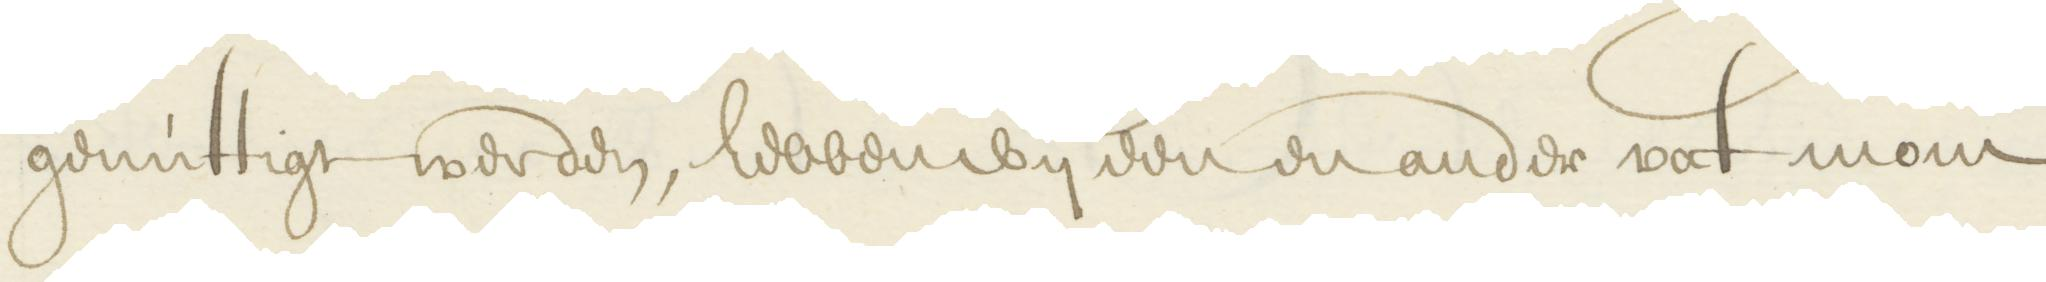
genuttigt werden, hebben wy een en ander vat mom
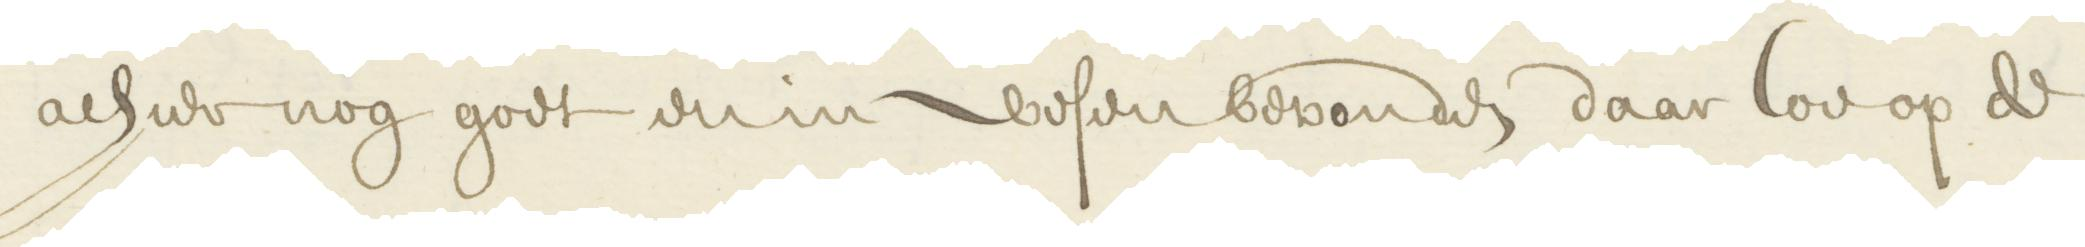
alhier nog goet en in wesen bevonden daar toe op de
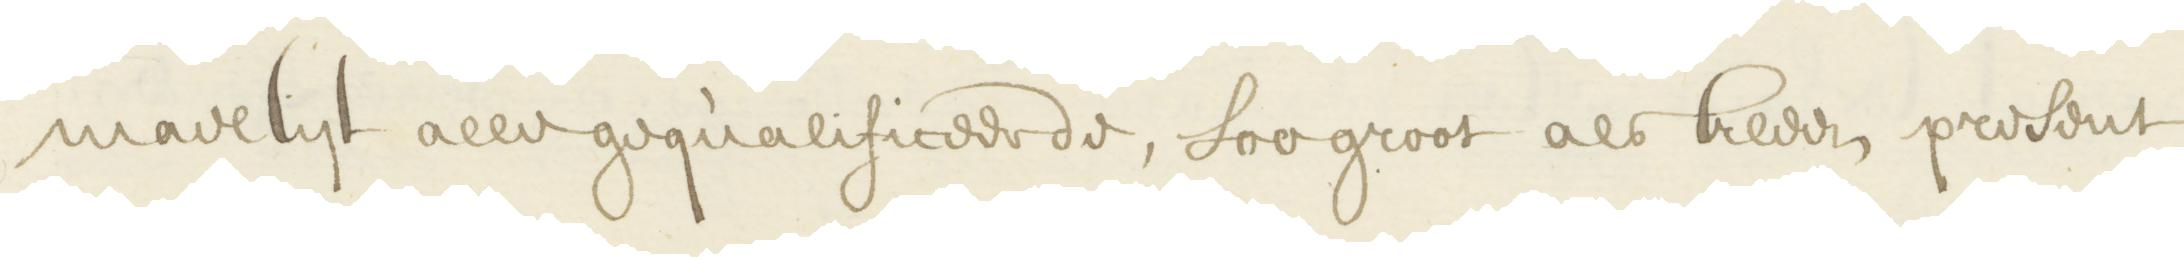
maeltijt alle gequalificeerde, Soo groot als kleen present
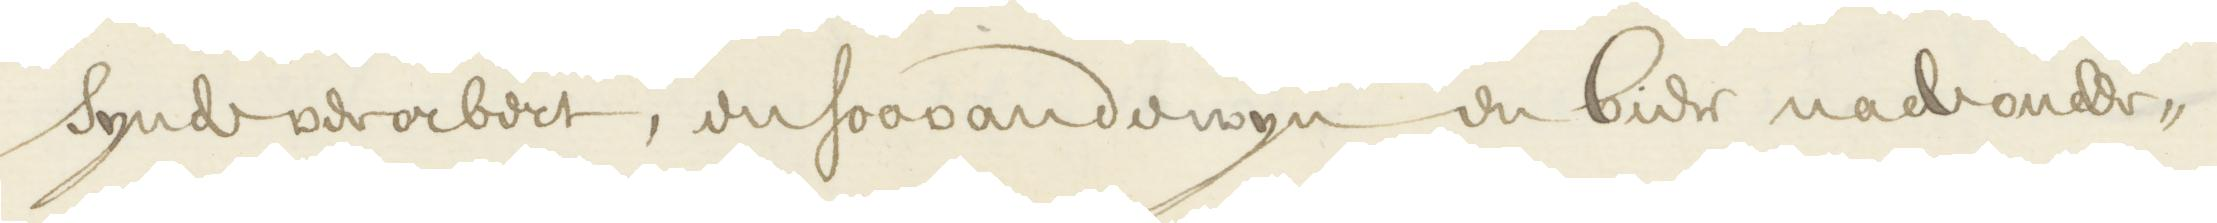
synde verorbert, en soovandewyn en bier nade onder„
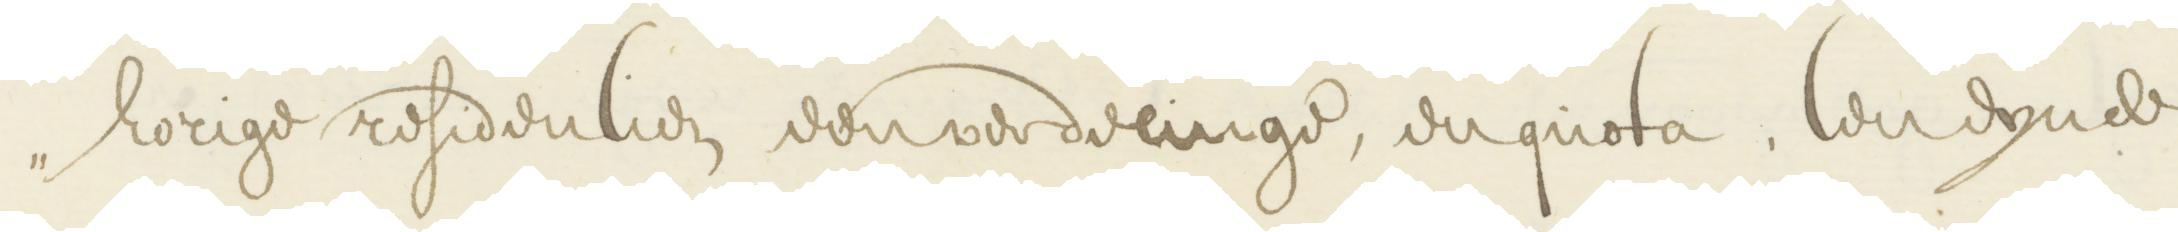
„ horige residentien een verdelinge, en quota, ten eynde
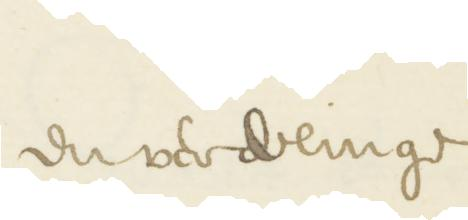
en verdelinge
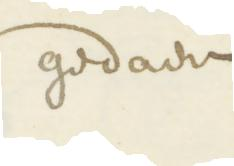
gedaen
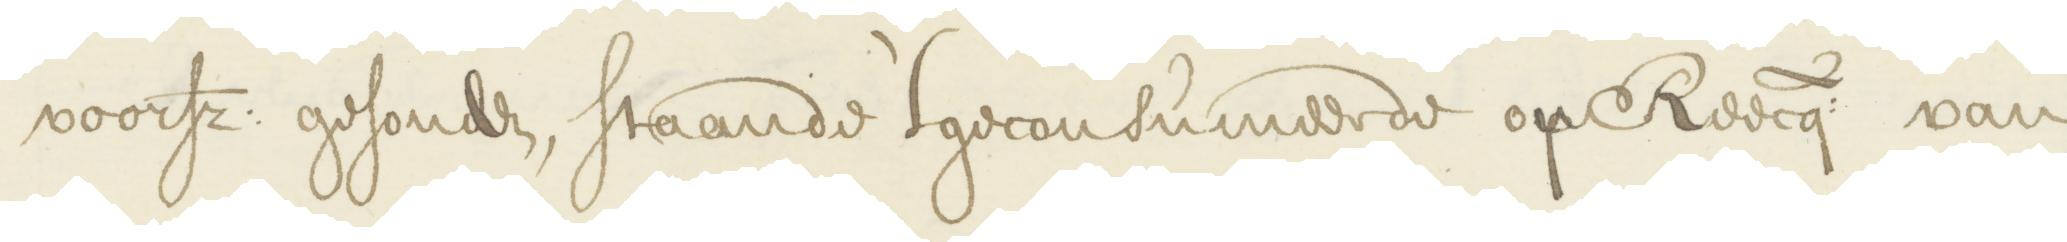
voorsz: gesonden, staande 'tgeconsumeerde op Reecq: van
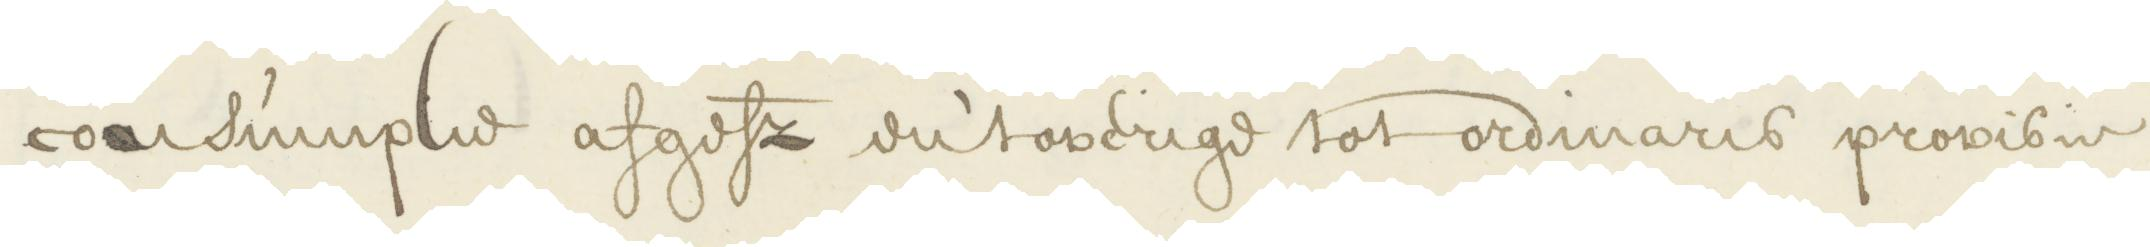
consumptie afgesz: en ’t overige tot ordinaris provisie
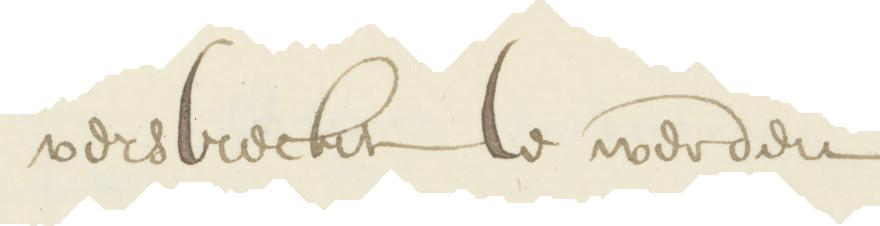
verstreckt te werden
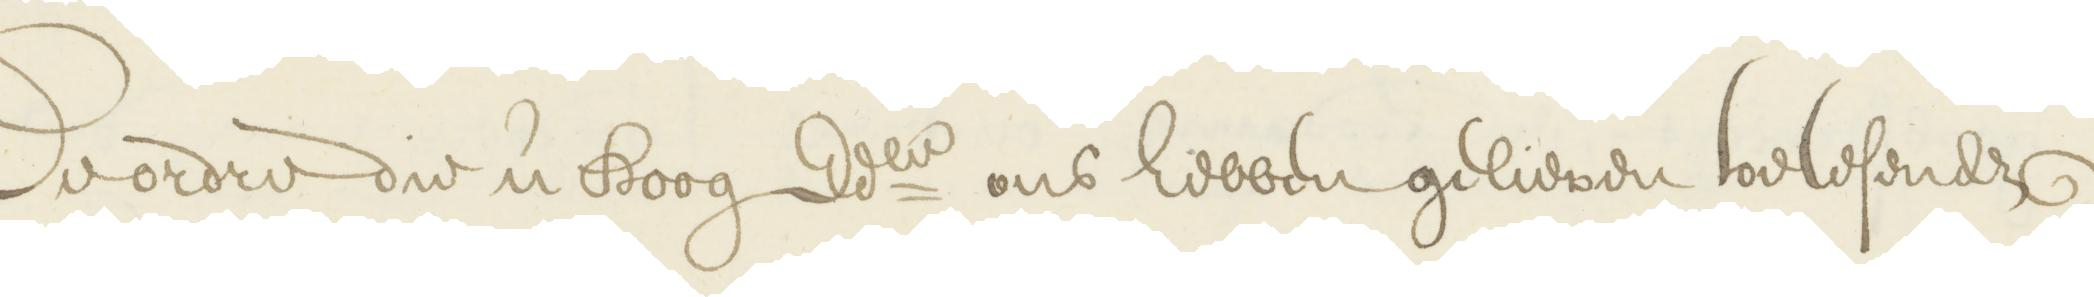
De ordre die u hoog Ed=le ons hebben gelieven toetesenden
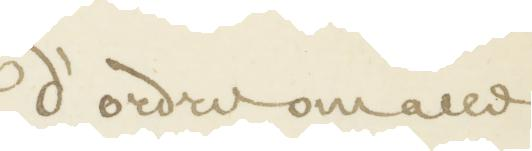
d’ ordre om alle
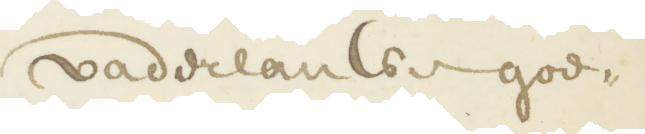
vaderlantse goe„
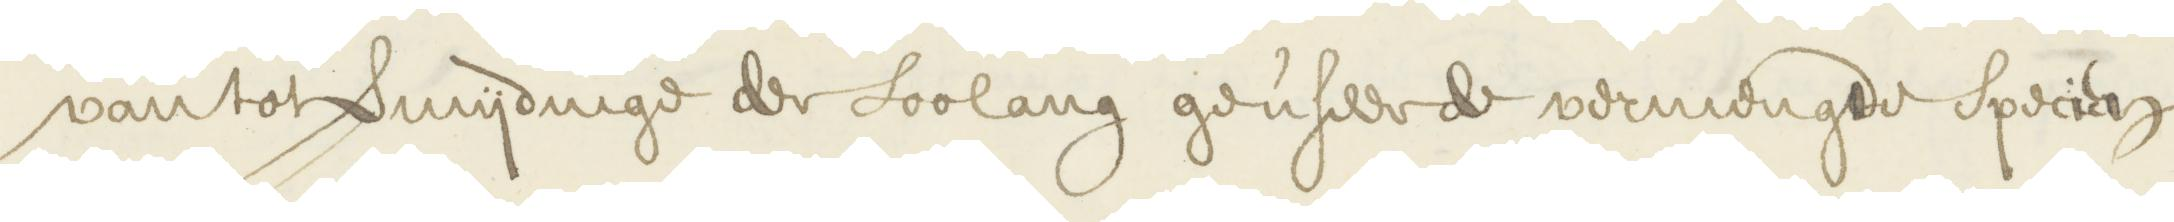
van tot vermijdinge der Soolang geuseerde vermengte specien
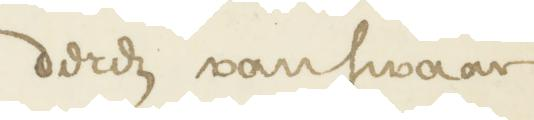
deren van swaar
